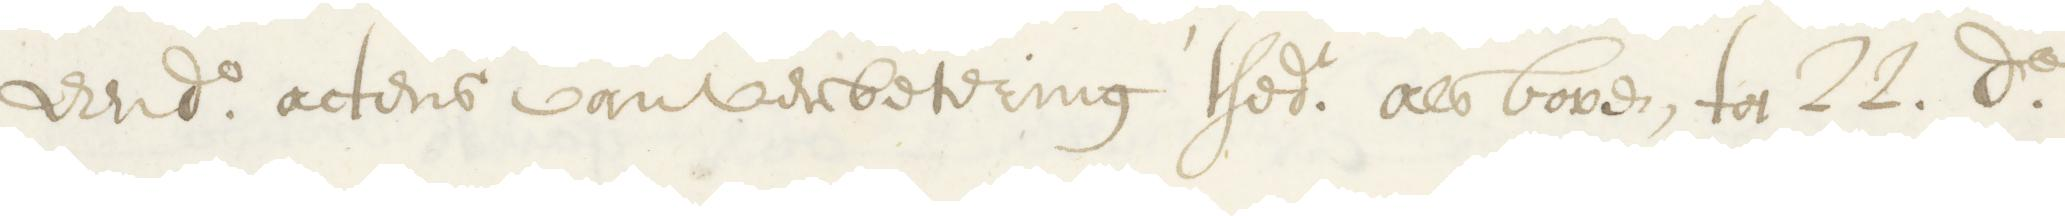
een d.o actens van verbetering 'tsed.t als boven tot 22. d.o
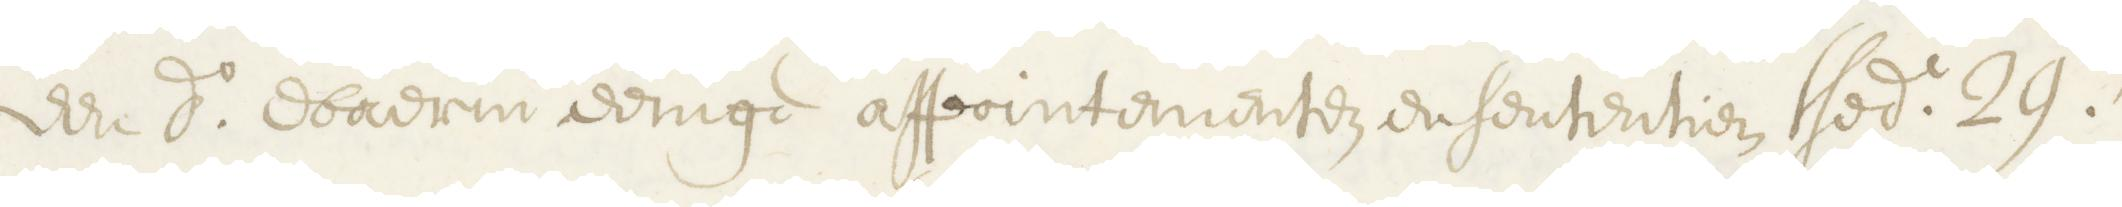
een d.o waerin eenige appointementen en sententien tsed.t 29.n
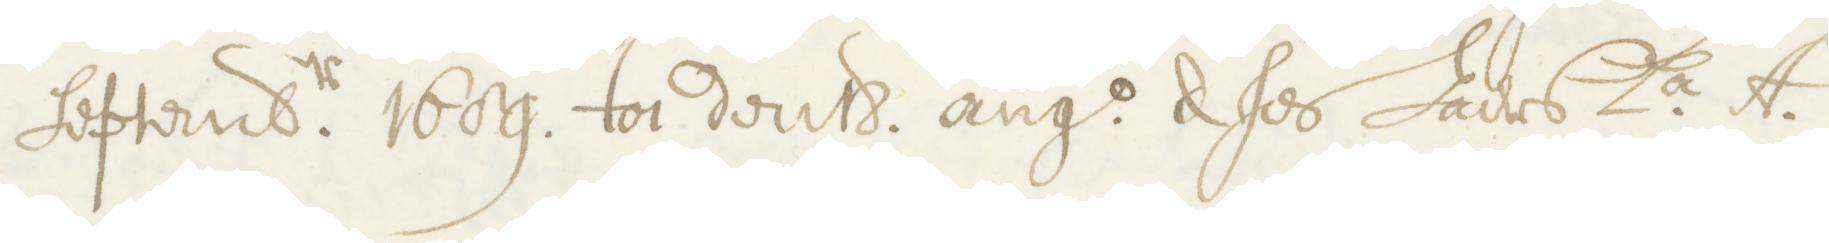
Septemb.r 1689. tot den 18. aug.o deses Iaers L.a A.
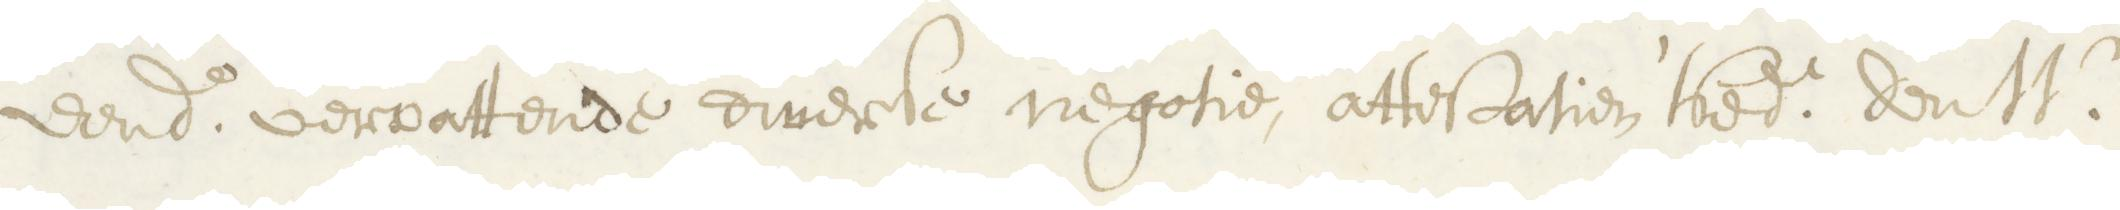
een d.o vervattende diverse negotie, attestatien 'tsed. den 11.n
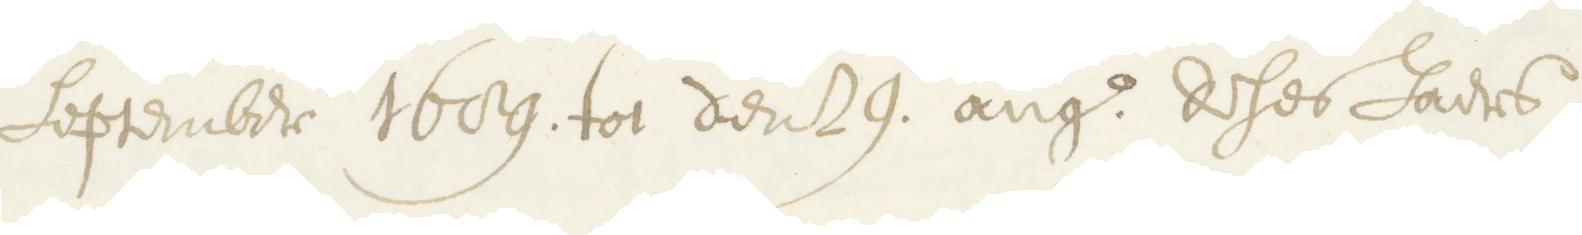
September 1689. tot den 29. aug.o deses Iaers
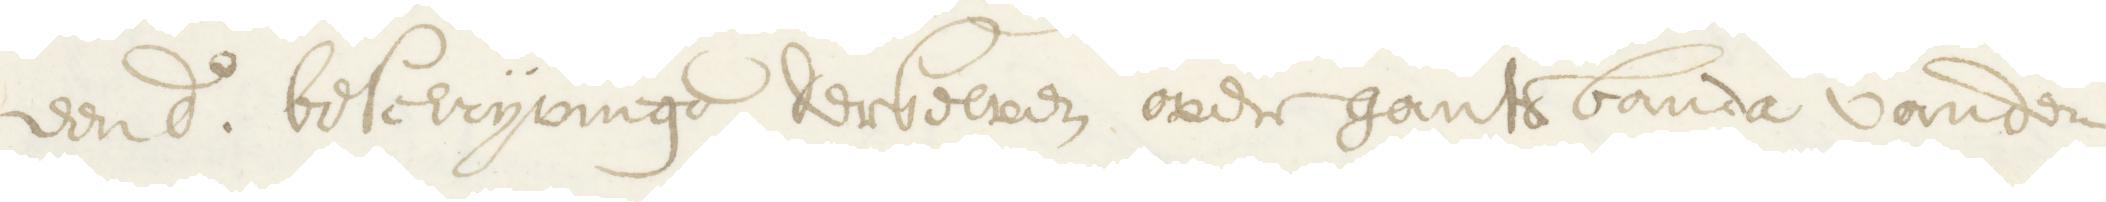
een d.o beschrijvinge derselven over gants banda vanden
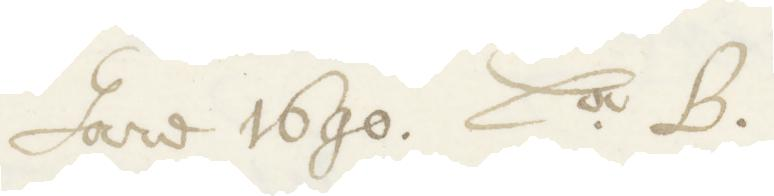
Iare 1690. L.a B.
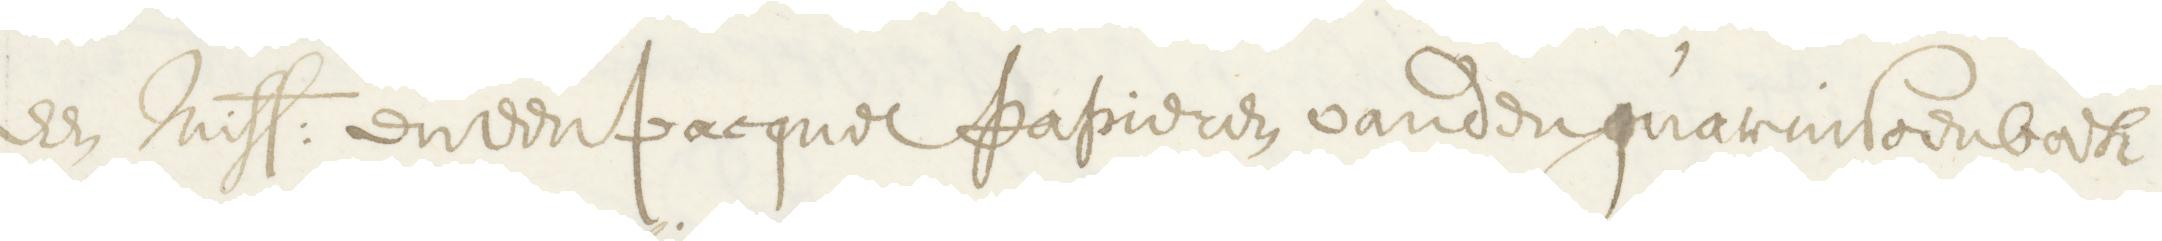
een miss: en een pacquet papieren van den guarnisoenboek
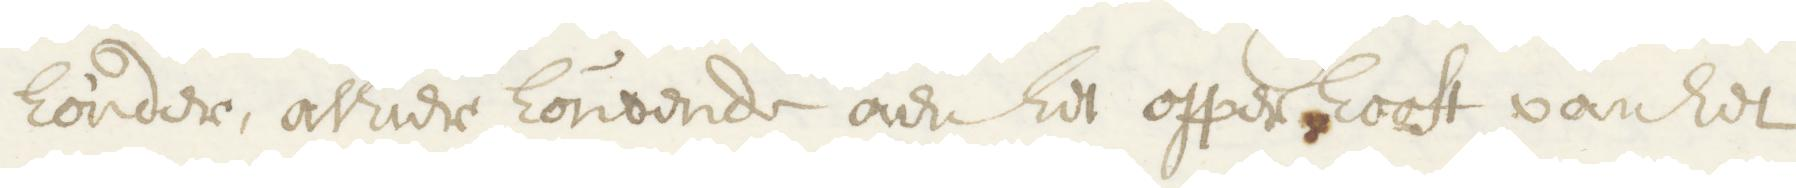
houder, alhier houdende aen het opperhooft van het
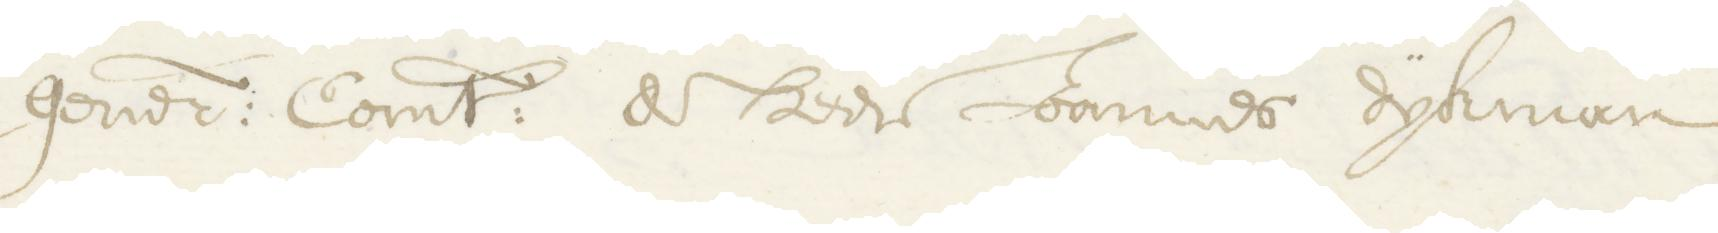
gener: Comt: de heer Ioannes dijkman
